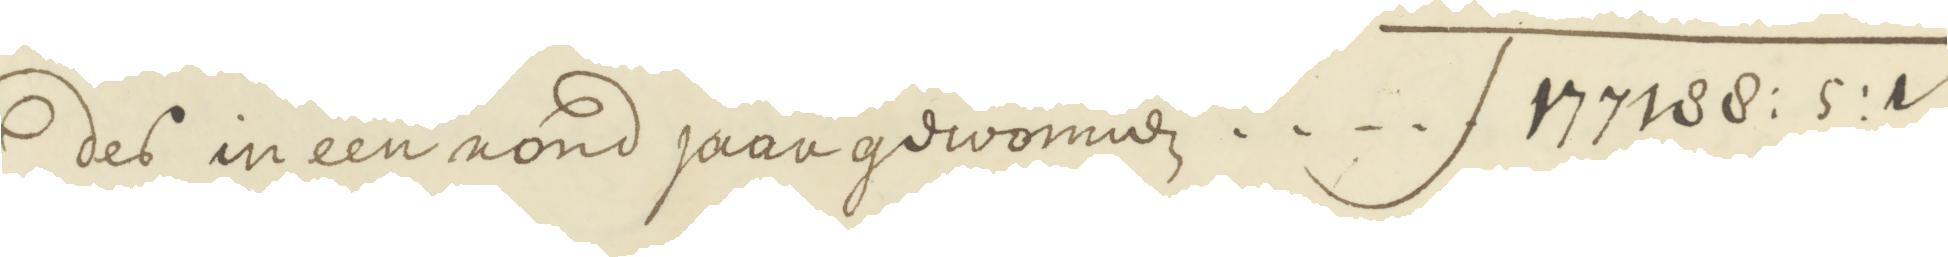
des in een rond jaar gewonnen . . - . ƒ 177188: 5: 1
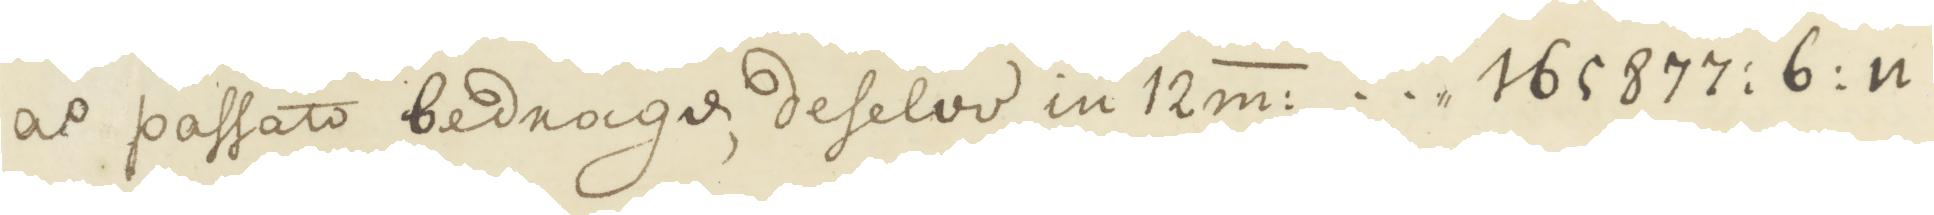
ao passato bedragen deselve in 12m: . . „ 165877: 6: 11
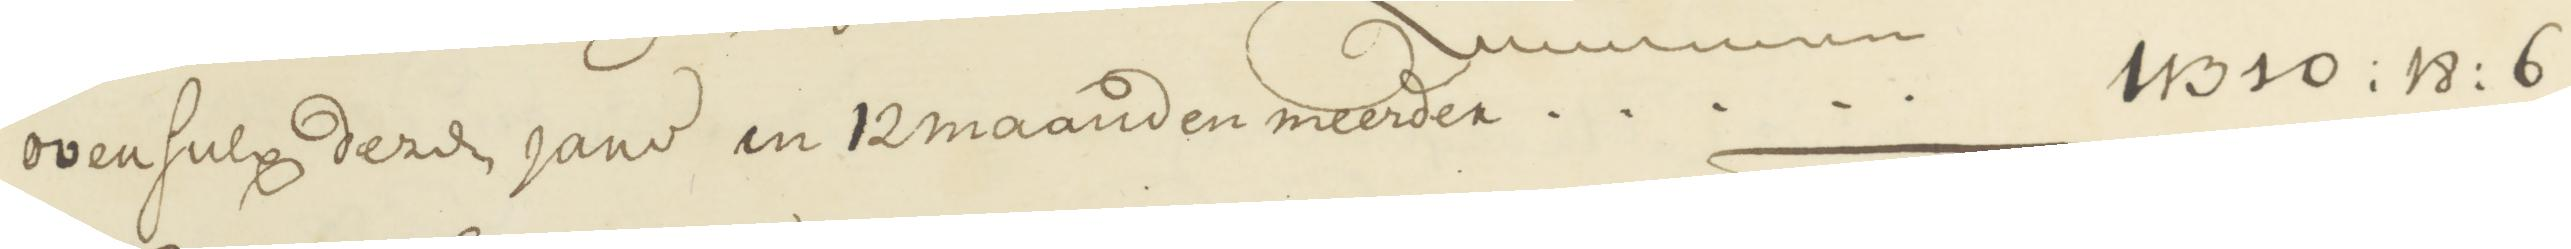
oversulx dezen jare in 12 maanden meerder . . . - . 11310: 18: 6
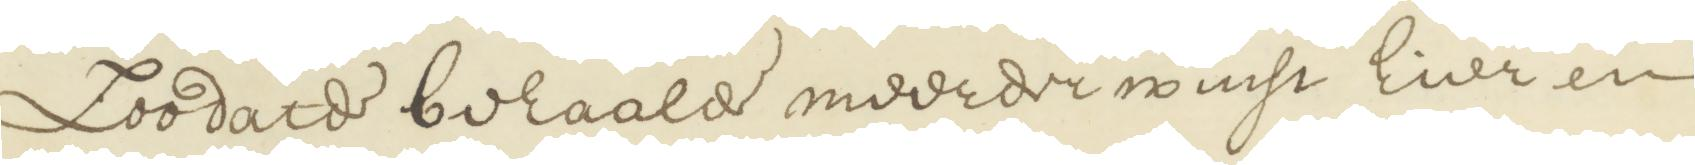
zoo dat de behaalde meerder winst hier en
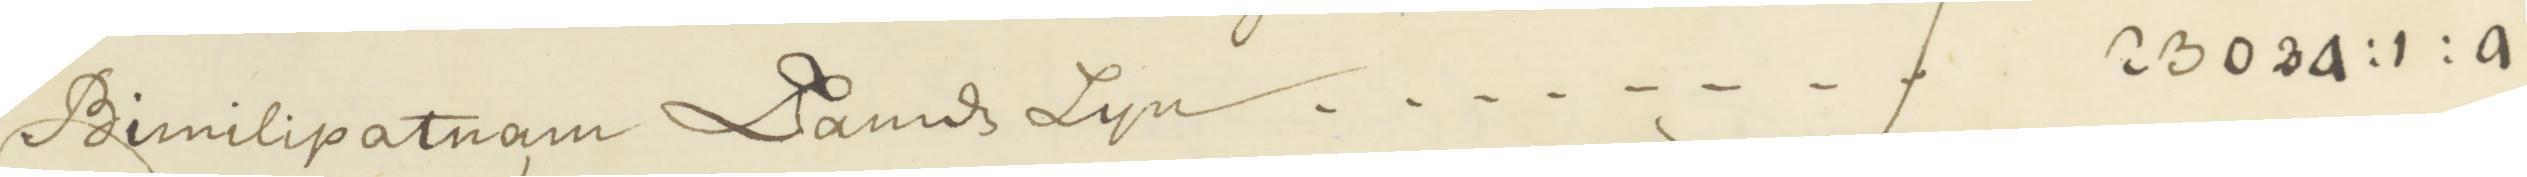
Bimilipatnam zamen zyn . . - - - - - ƒ 23034: 1: 4
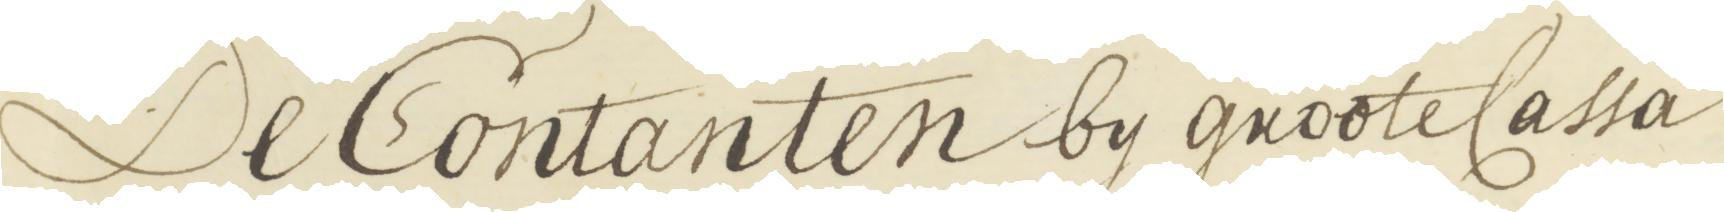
De Contanten by groote Cassa
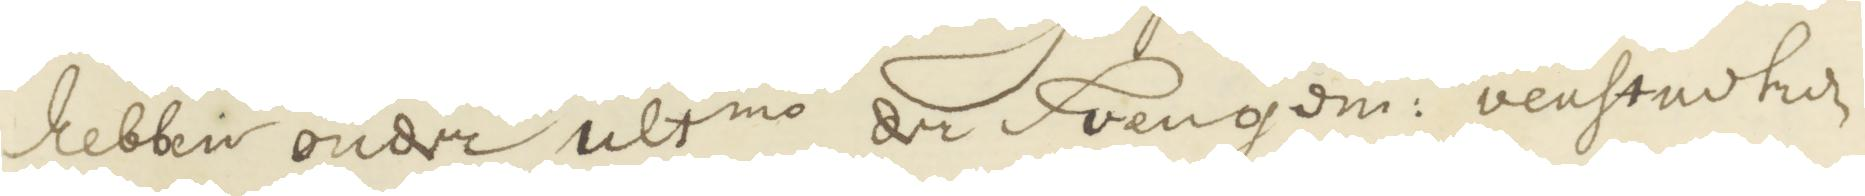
hebben onder ultmo der Evengem: verstreken
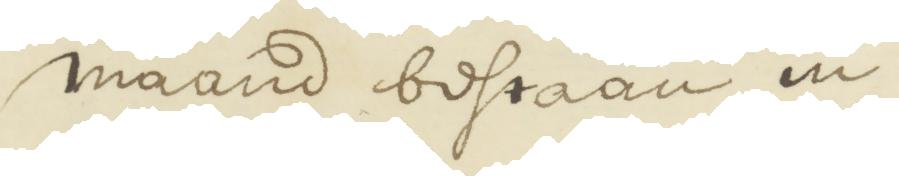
maand bestaan in
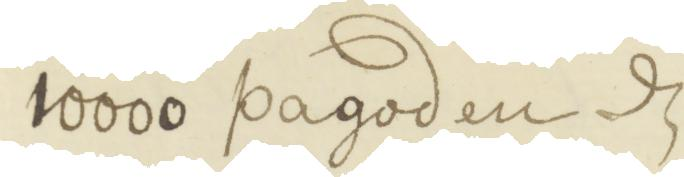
10000 pagoden en
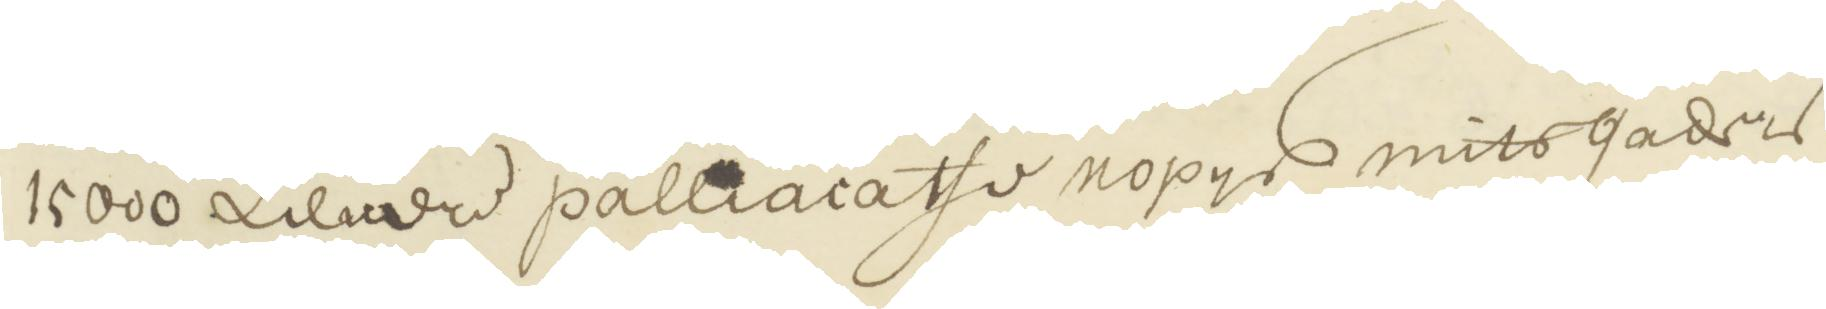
15000 Zilvere palliacatse ropijs mitsgaders
